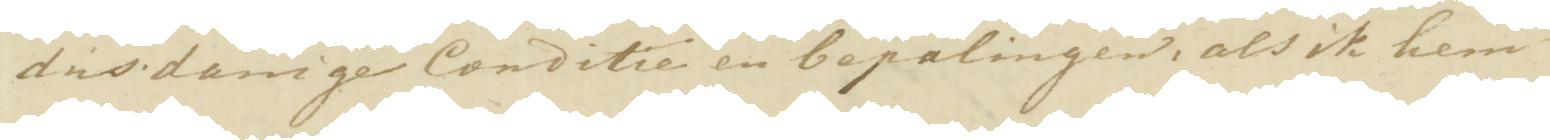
dus danige Conditie en bepalingen, als ik hem
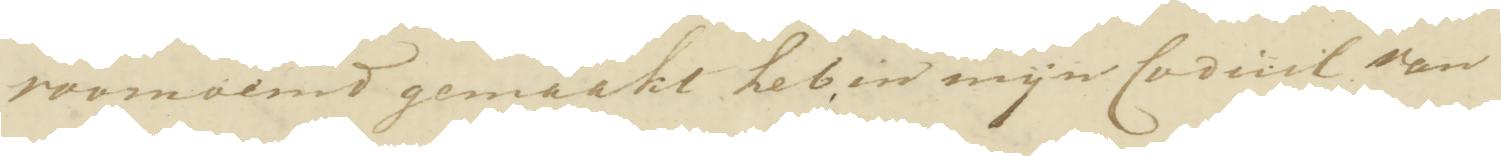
voornoemd gemaakt heb, in mijn Codicil van
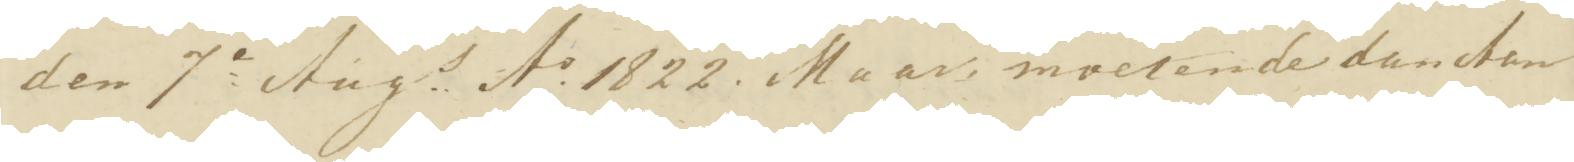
den 7:e Aug.s A.o 1822. Maar, moetende dan Aan
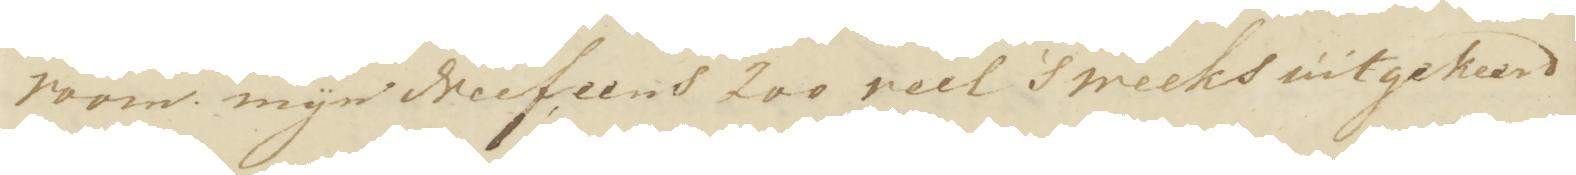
voorn: mijn Neef, eens zoo veel 's weeks uitgekeerd
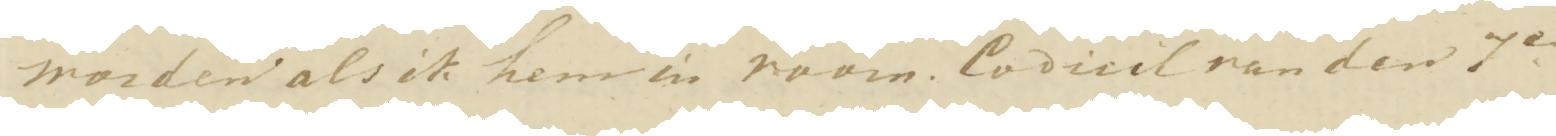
worden als ik hem in voorn. Codicil van den 7.e
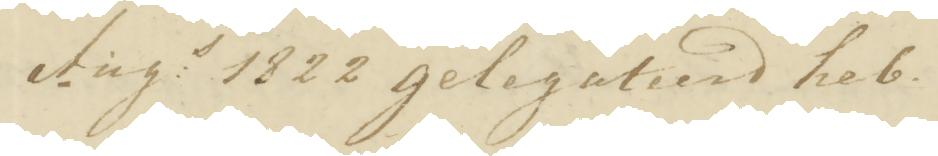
Aug:s 1822 gelegateerd heb.
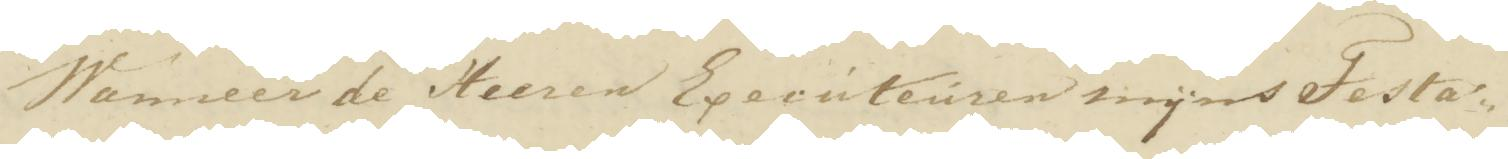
Wanneer de Heeren Executeuren mijns Testa„
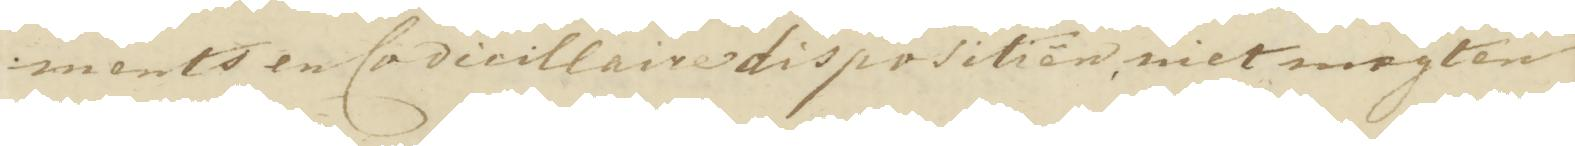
ments en Codicillaire dispositiën, niet mogten
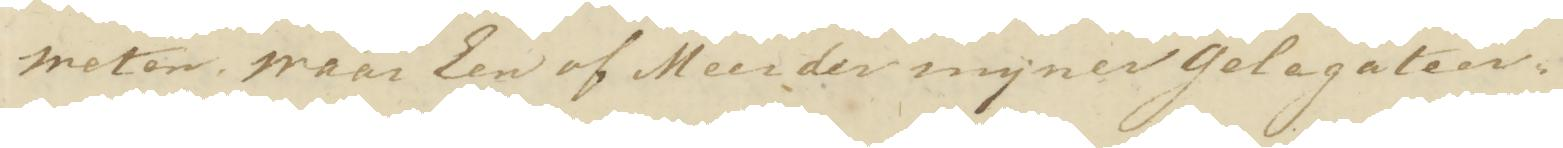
weten, waar Een of Meerder mijner gelegateer„
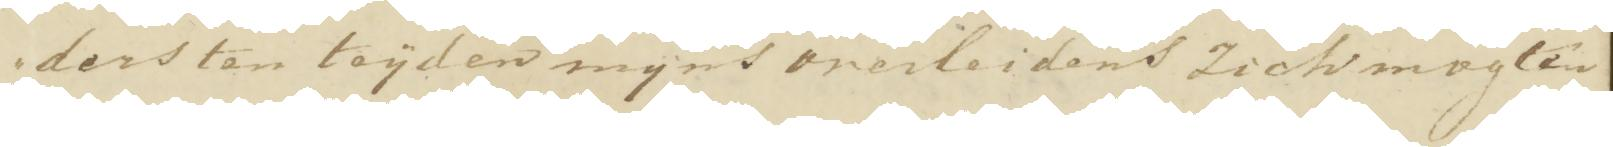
„ders ten teijden mijns overleidens zich mogten
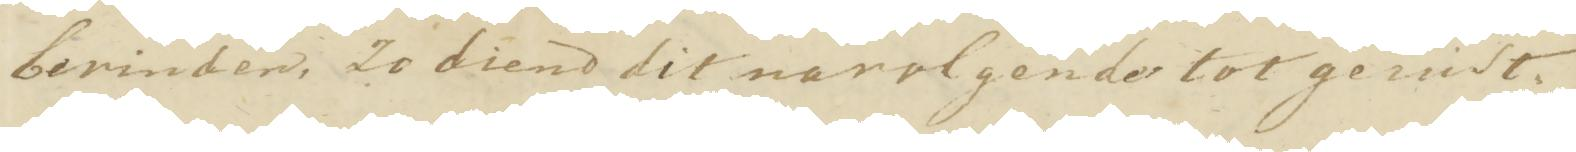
bevinden, zo diend dit navolgende tot gerust„
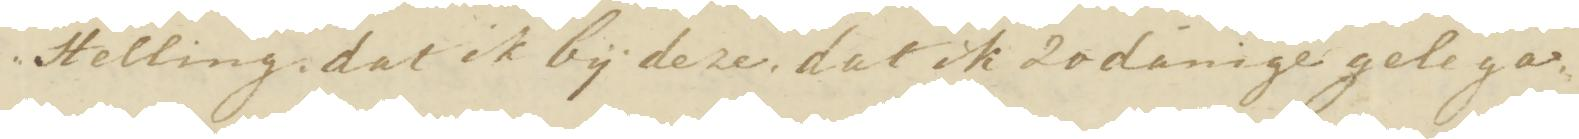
„stelling, dat ik bij deze, dat ik zodanige gelega„
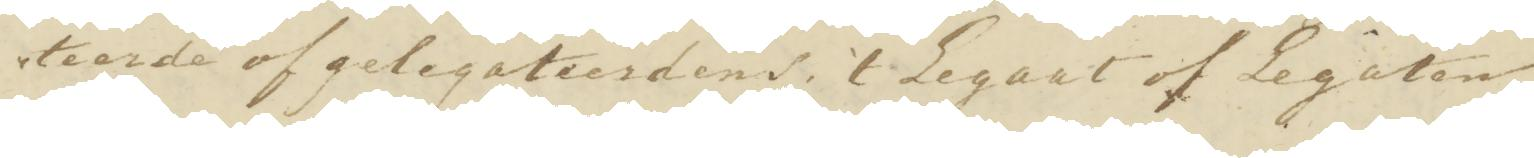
teerde of gelegateerdens, ’t Legaat of Legaten
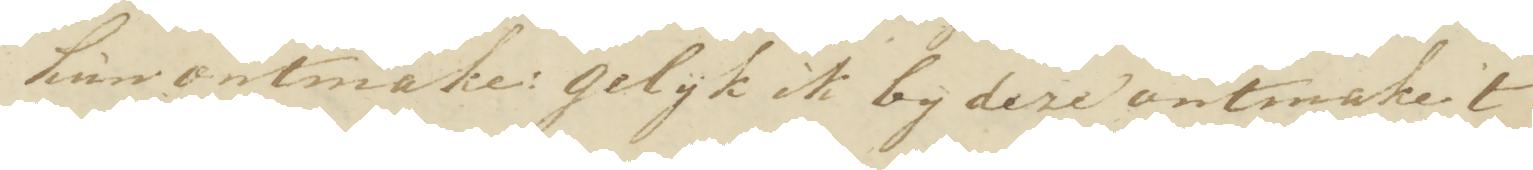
hun ontmake: gelijk ik bij deze ontmake ’t
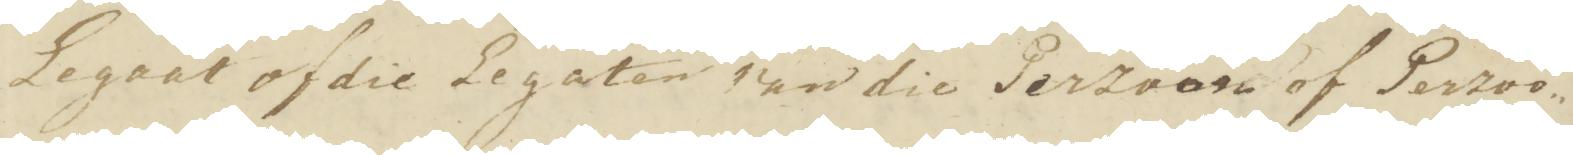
Legaat of die Legaten van die Perzoon of Perzoo„
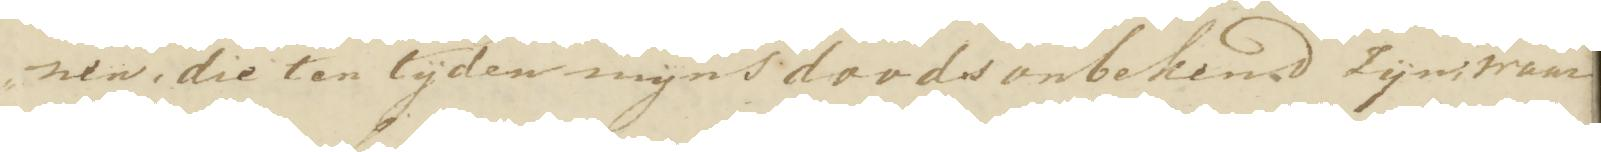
„nen, die ten tijden mijns doods onbekend zijn, waar
